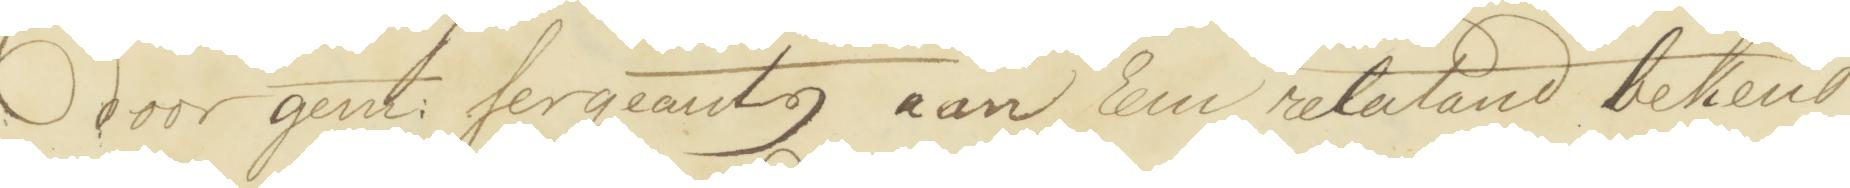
door gem: sergeants aan hem relatand bekend
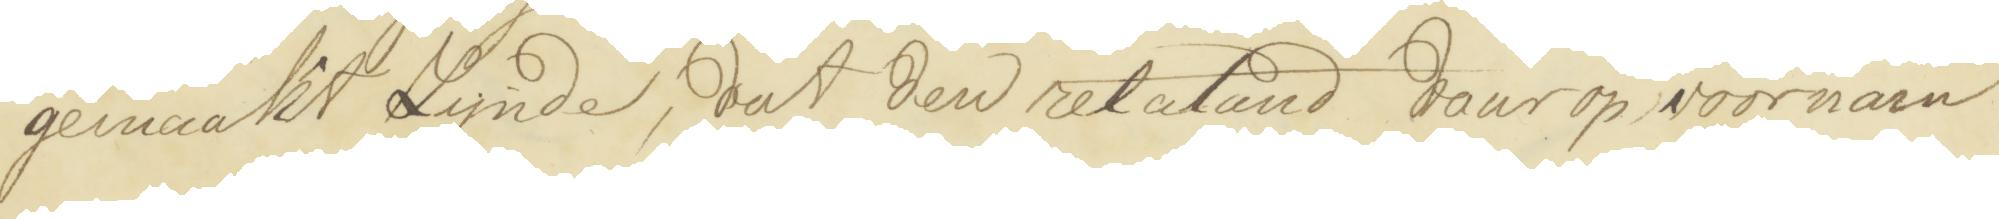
gemaakt zijnde, dat den retaland daar op, voornam
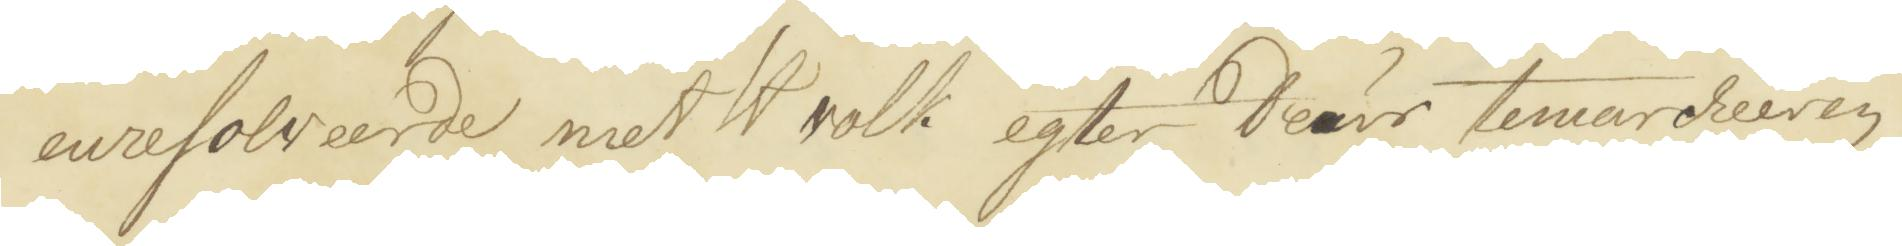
enresolveerde met ’t volk egter deur temarcheeren
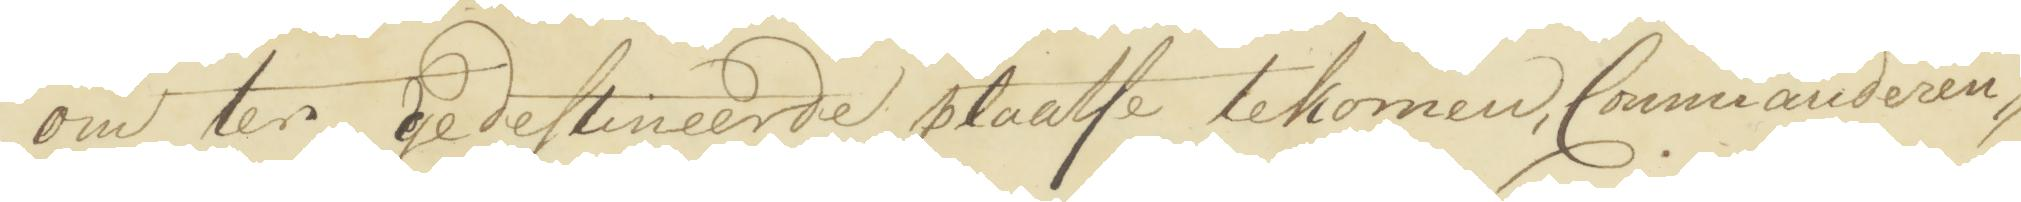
om ter gedestineerde plaatse tekomen, Commanderen
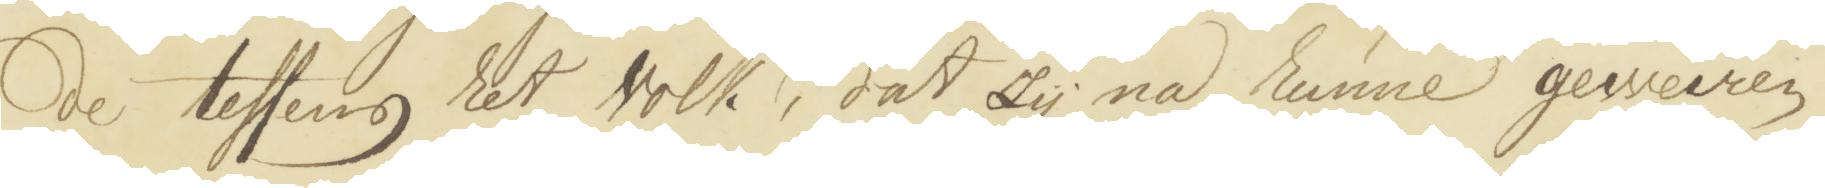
de teffens het volk, dat zij na hunne geweeren
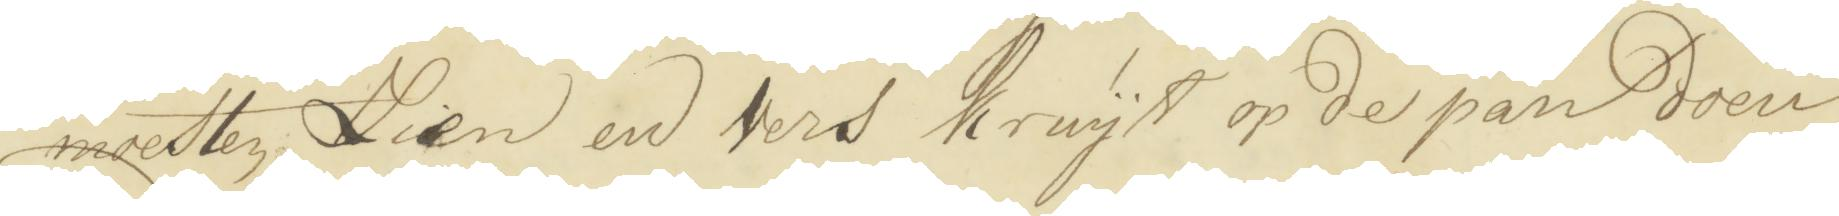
moesten zien en vers kruijt op de pan doen,
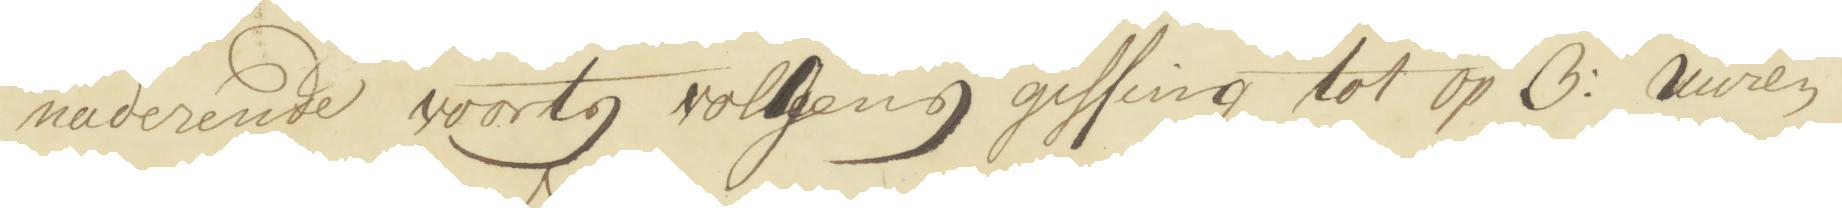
naderende voorts volgens gissing tot op 3: uuren
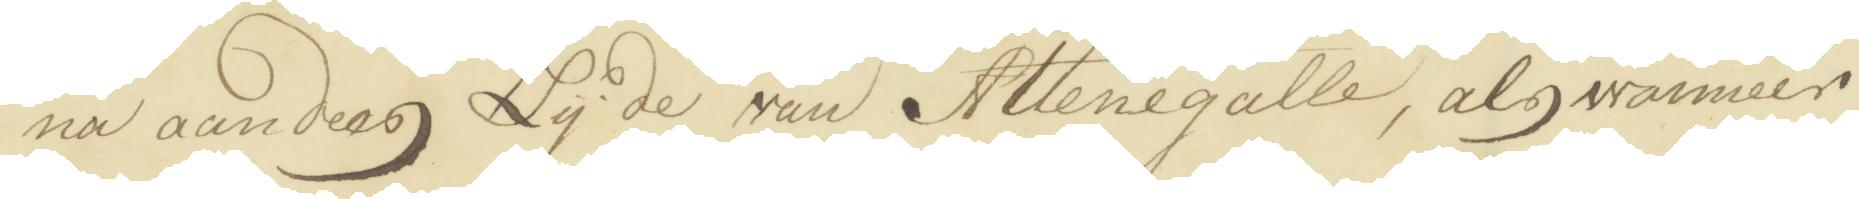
na aan dees Zij de van Attenegalle, als wanneer
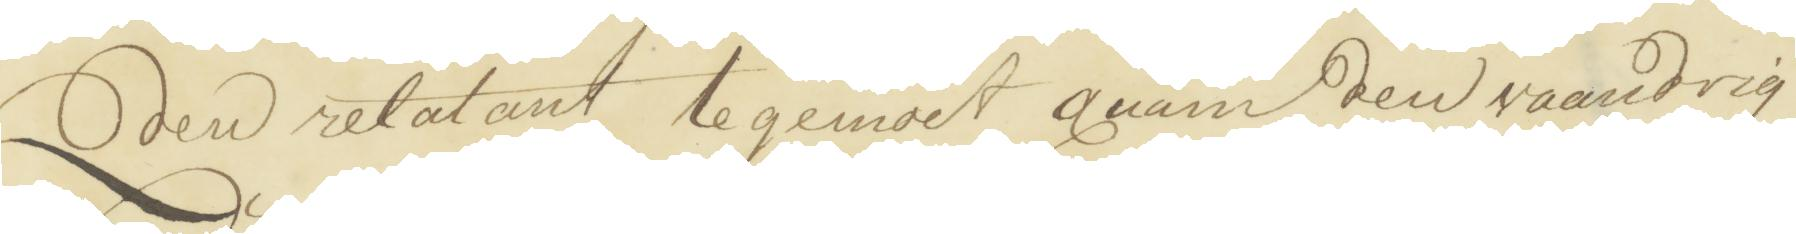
den relatant te gemoet quam den vaandrig
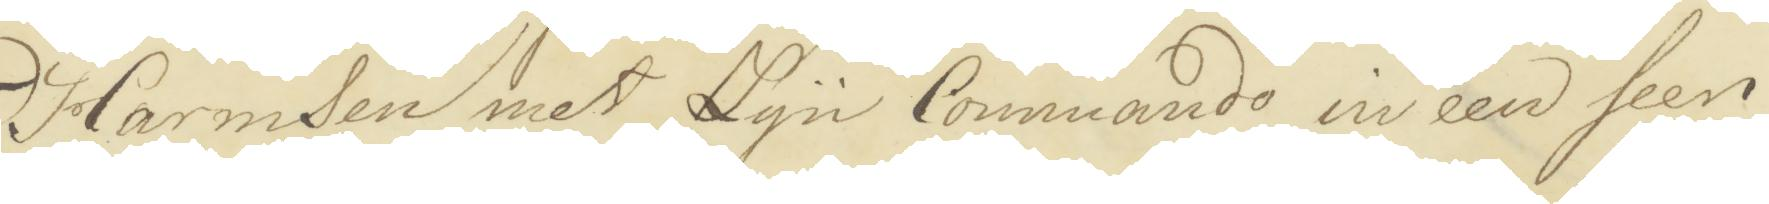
Harmsen met zijn Commando in een seer
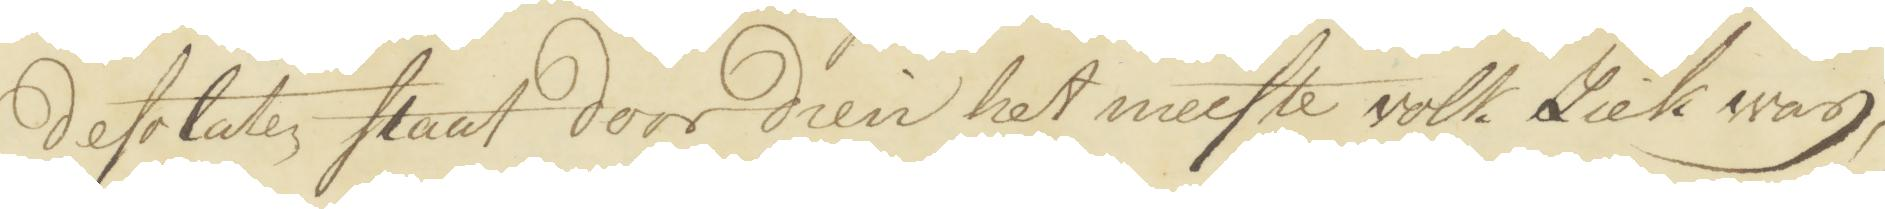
desolaten staat door dien het meeste volk ziek was,
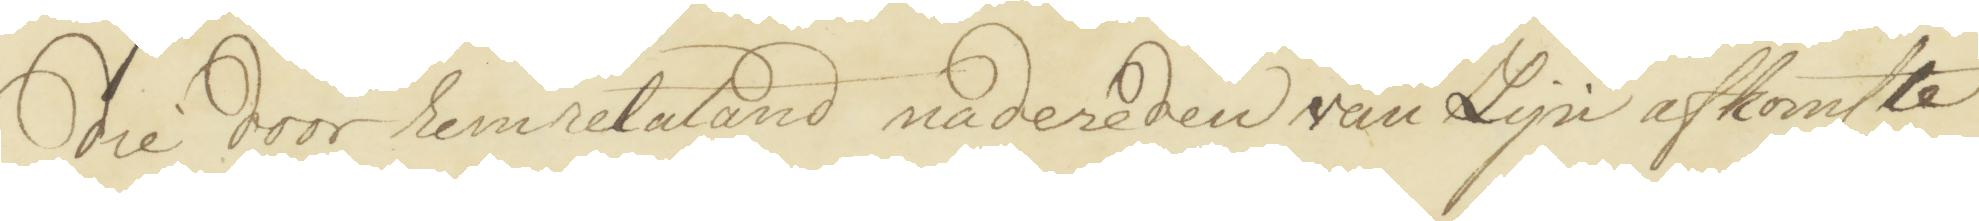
die door hem relatand nadereden van zijn afkomste
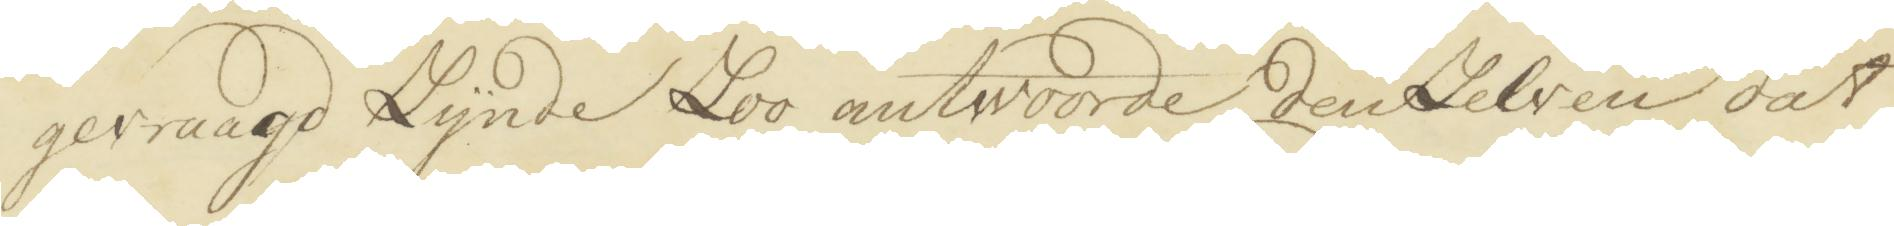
gevraagd zijnde zoo antwoorde denzelven dat
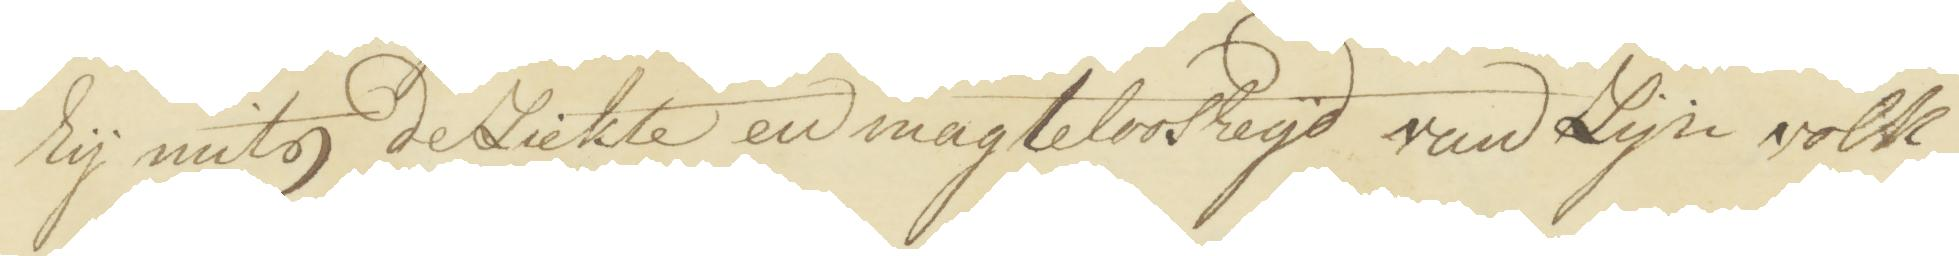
hij mits de ziekte en magteloosheijd van zijn volk
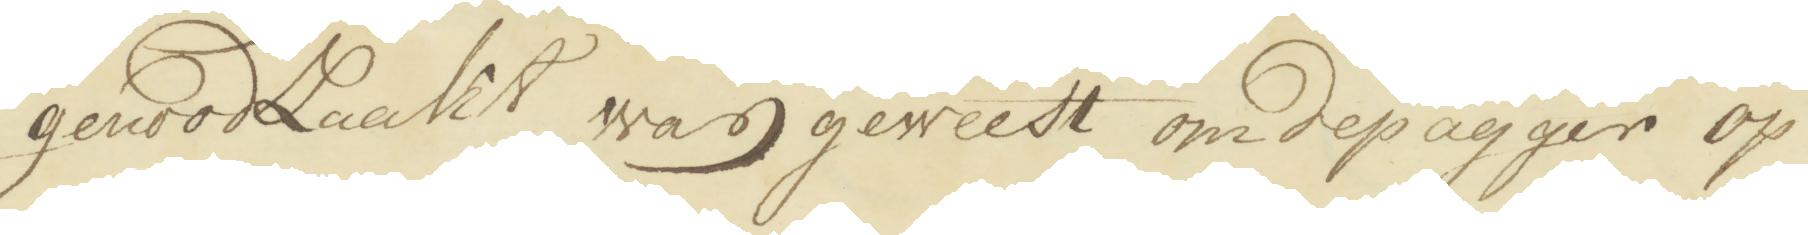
genoodzaakt was geweest om depagger op
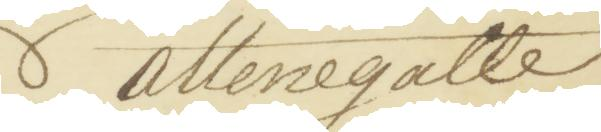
attenegalle
